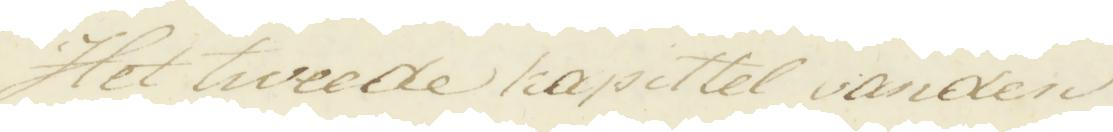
Het tweede kapittel vanden
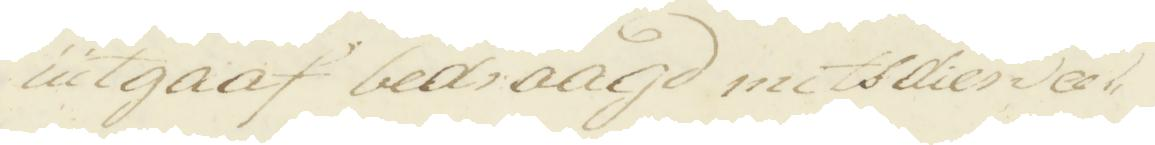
uitgaaf bedraagd mitsdien ee„
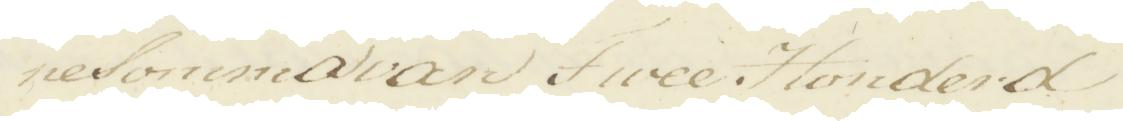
ne somma van Twee Honderd
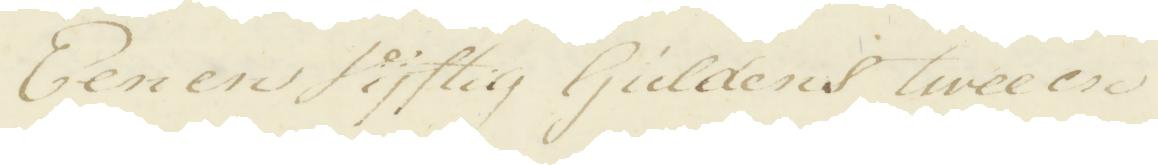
Een en Vijftig Guldens twee en
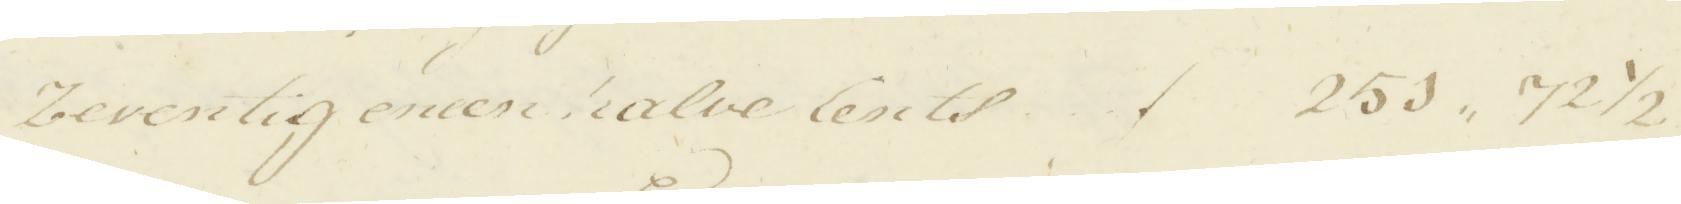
zeventig en een halve Cents ƒ 251 „ 72½
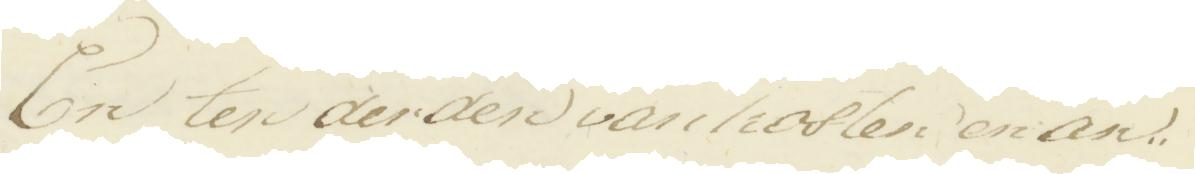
En ten derden van kosten en an„
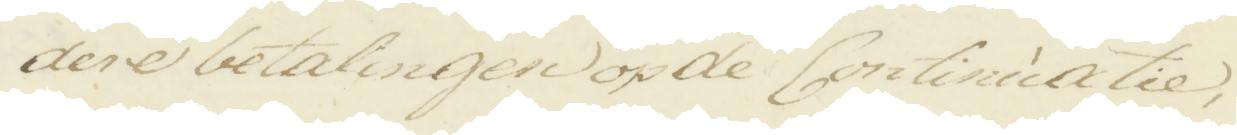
dere betalingen op de Continuatie,
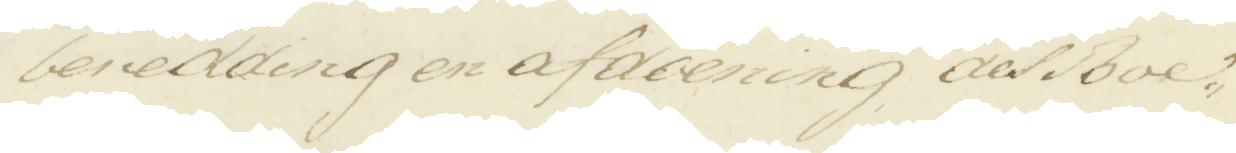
beredding en afdoening, des Boe„
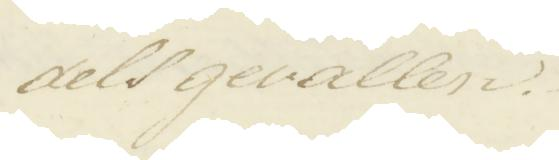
dels gevallen.
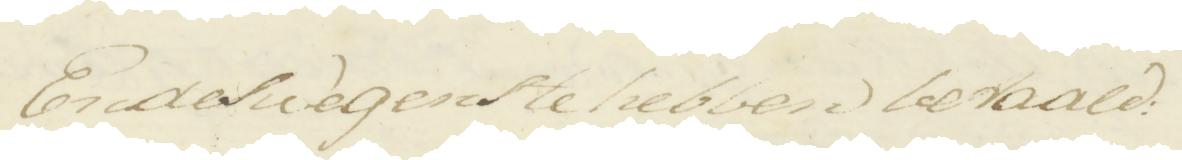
En deswegens te hebben betaald:
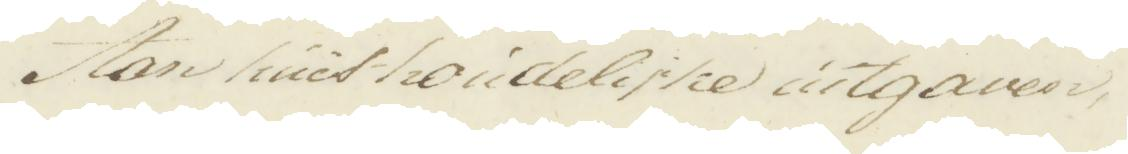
Aan huishoudelijke uitgaven,
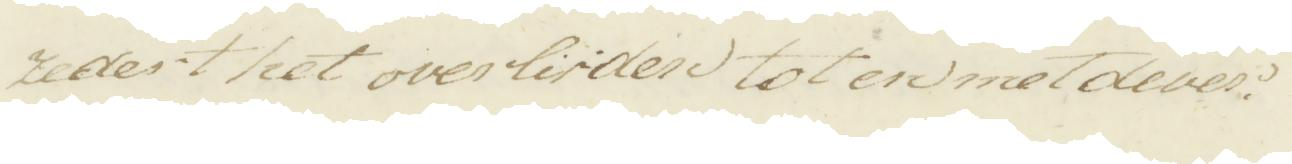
zedert het overlijden tot en met de ver„
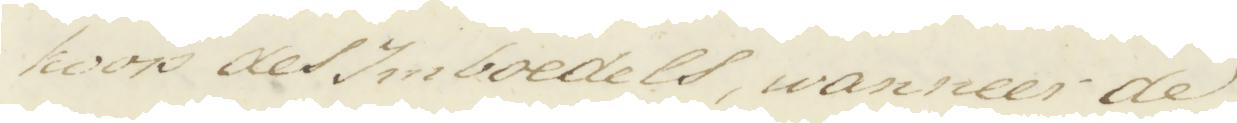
koop des Imboedels, wanneer de
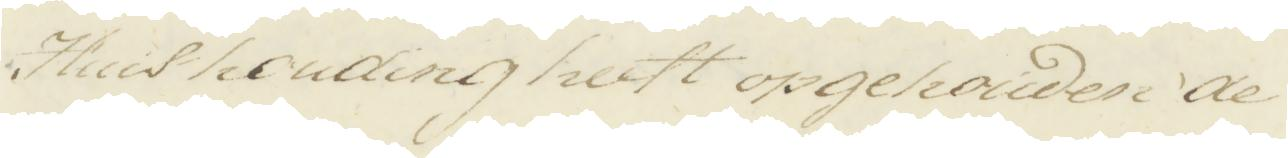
Huishouding heeft opgehouden de
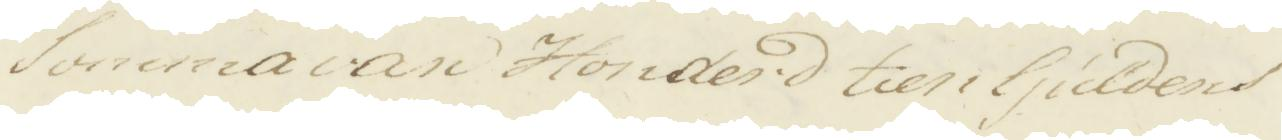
somma van Honderd tien Guldens
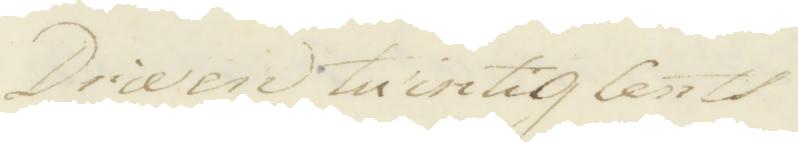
Drie en twintig Cents
